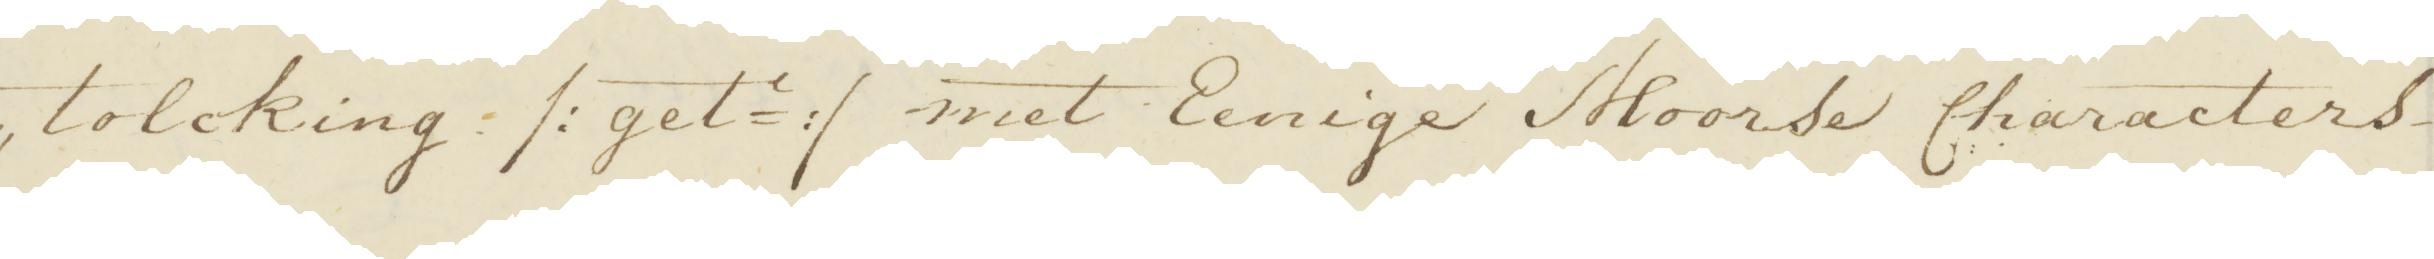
„tolcking: /: get=t: / met Eenige Moorse Characters
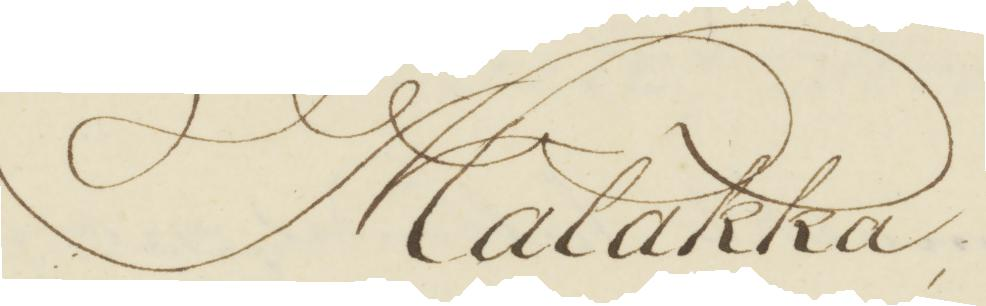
Malakka;
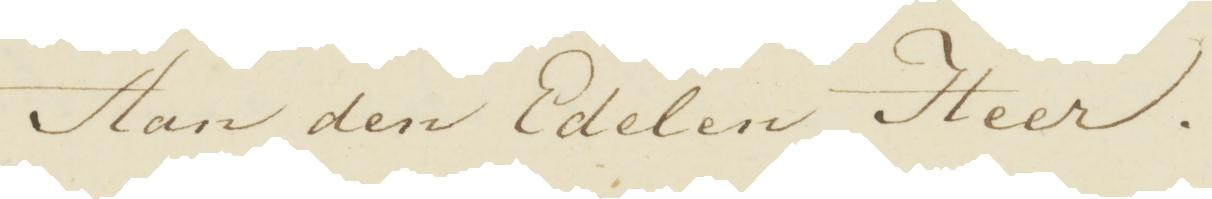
Aan den Edelen Heer.
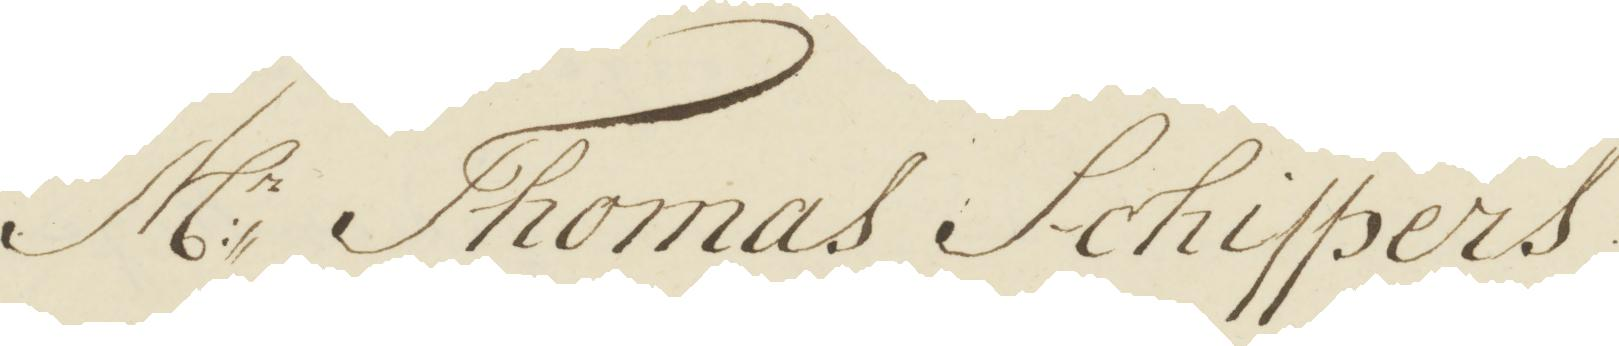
M:„r Thomas Schippers,
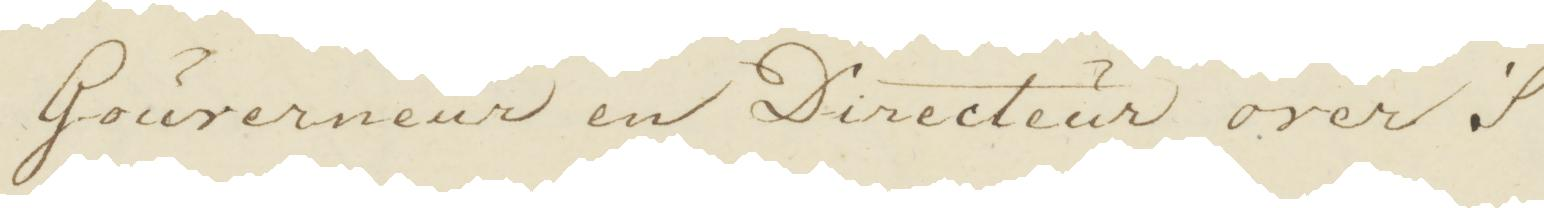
Gouverneur en Directeur over 'S
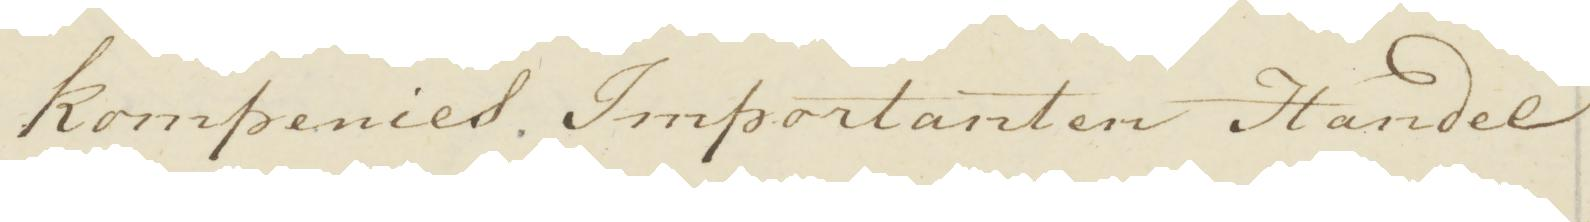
kompenies. Importanten Handel
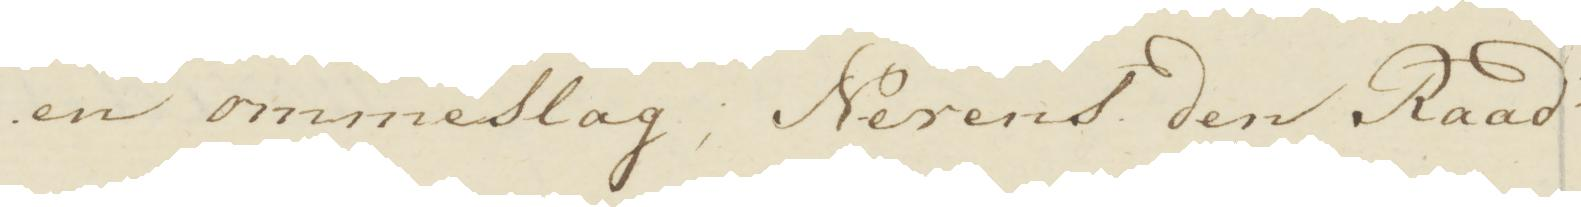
en ommeslag; Nevens den Raad:
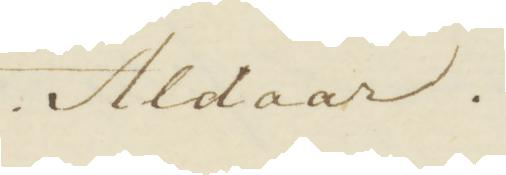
Aldaar.
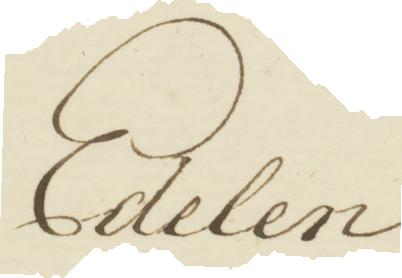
Edelen
